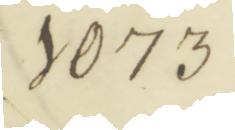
1073
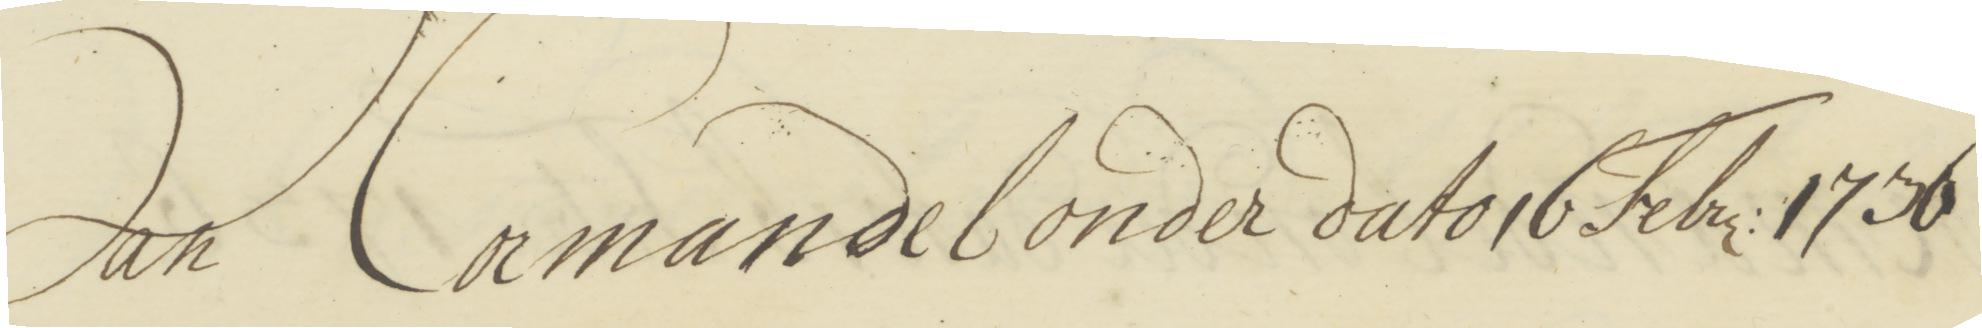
Van Cormandel onder dato 16 Febr: 1736
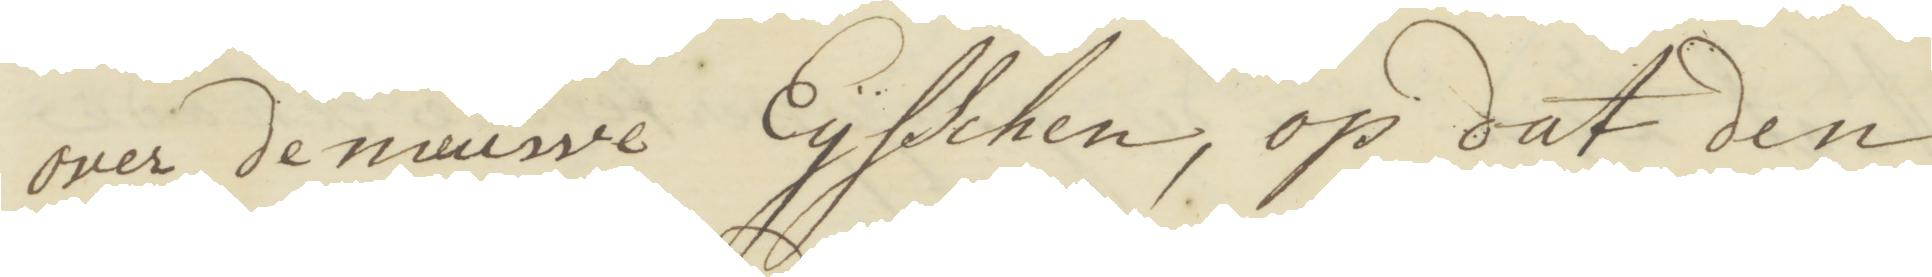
over de nieuwe Eijsschen, op dat den
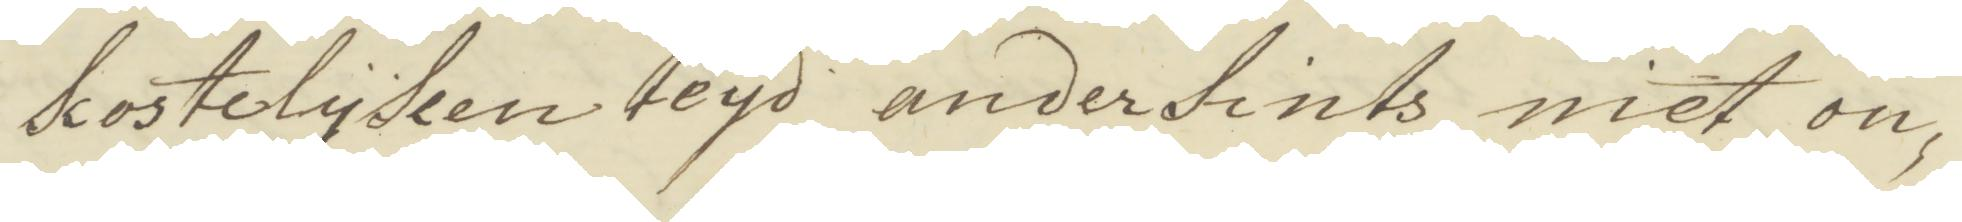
kostelijken teijd andersints niet on„
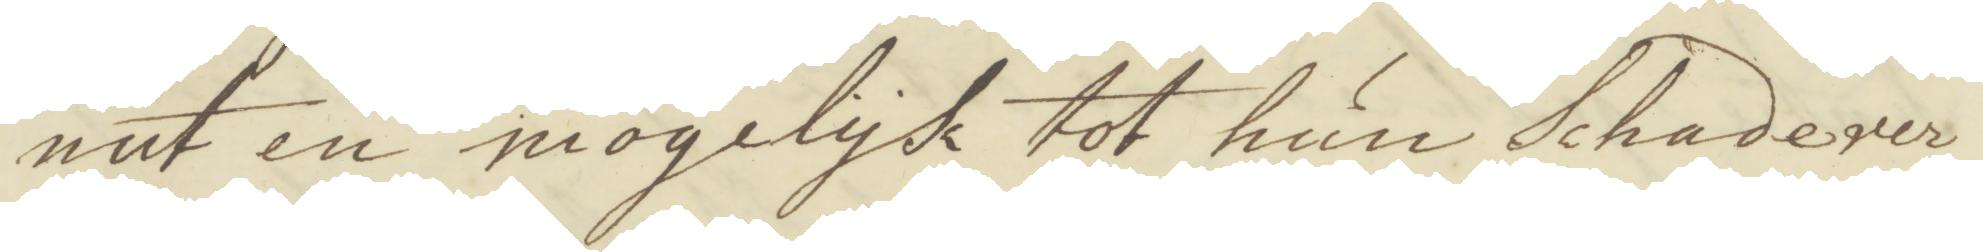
nut en mogelijk tot hun schade ver
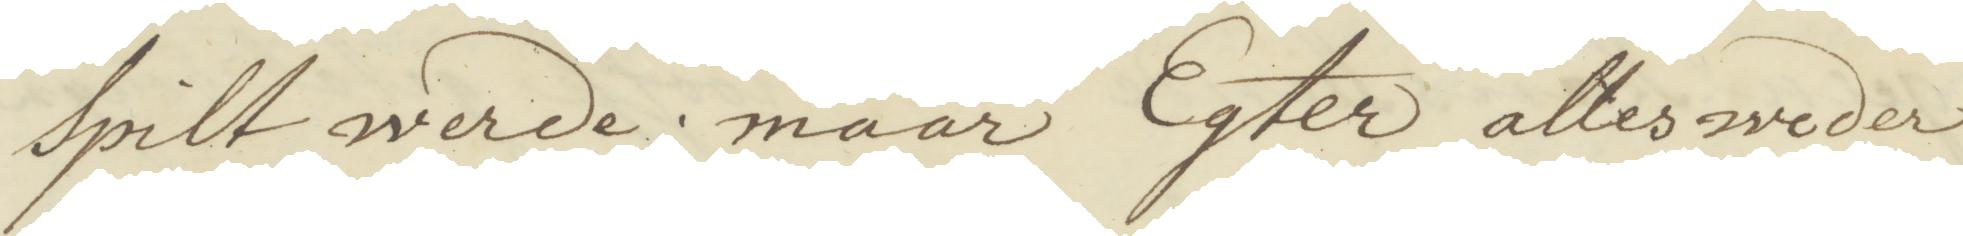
spilt werde; maar Egter alles weder
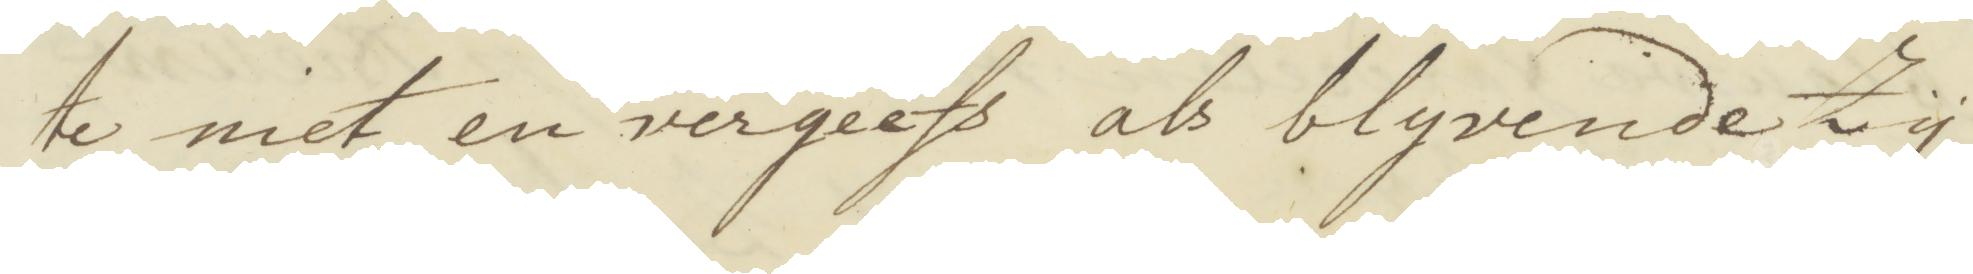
te niet en vergeefs als blyvende zij
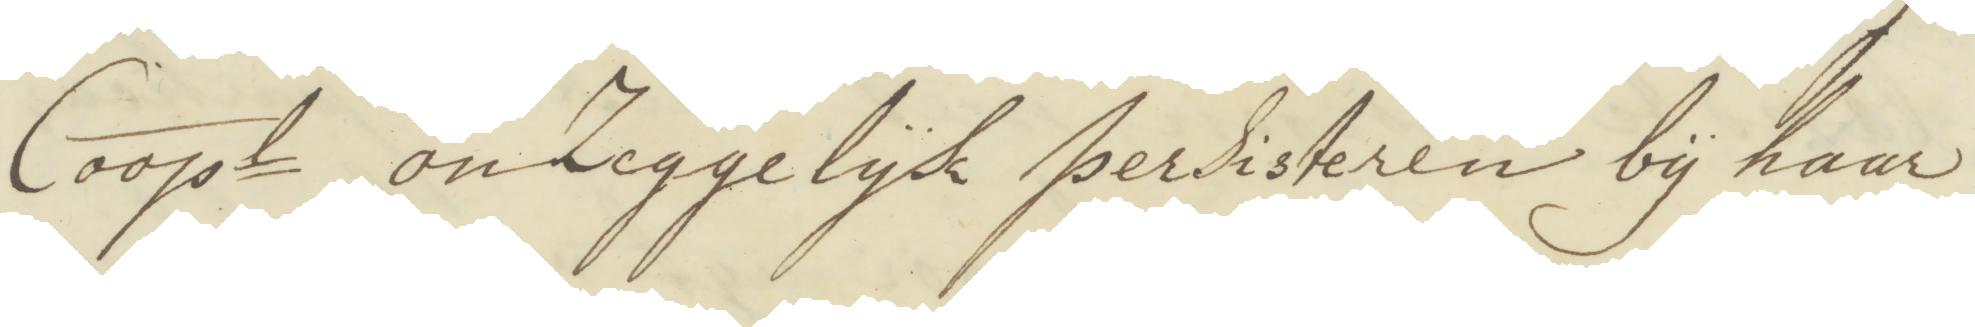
Coop=l onzeggelijk persisteren bij haar
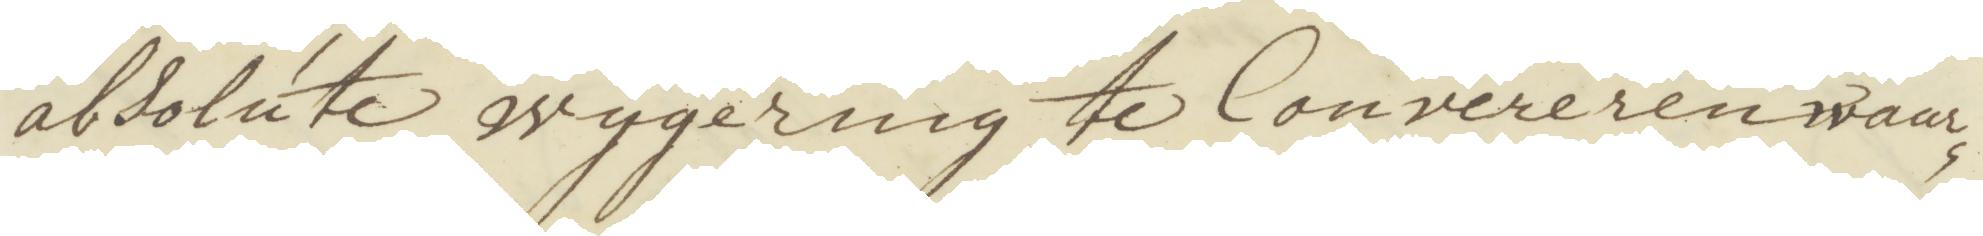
absolute wijgering te Convereren waar„
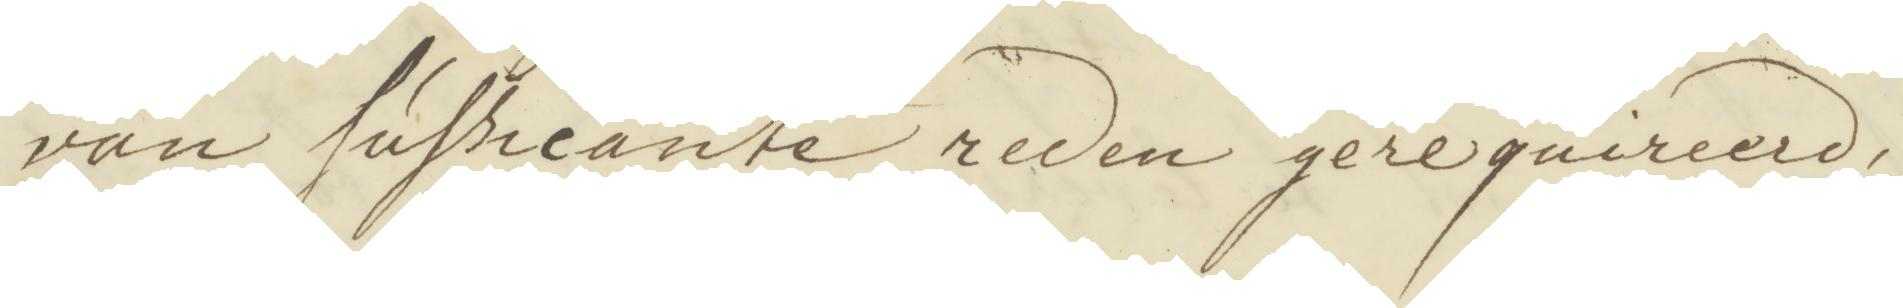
van sufficante reden gerequireerd,
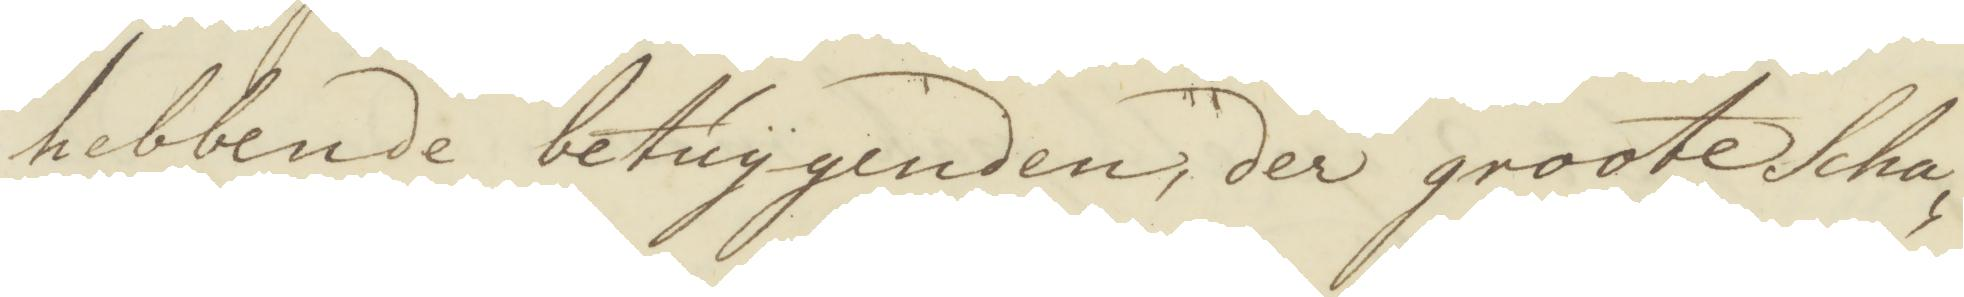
hebbende betuijgenden, der groote scha„
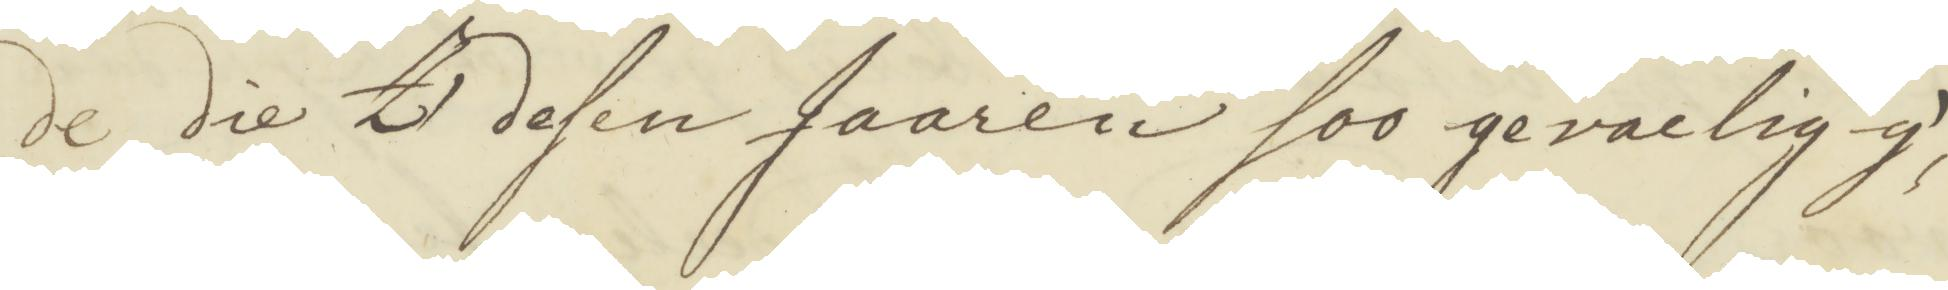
de die z' desen Jaaren soo gevaelig g'„
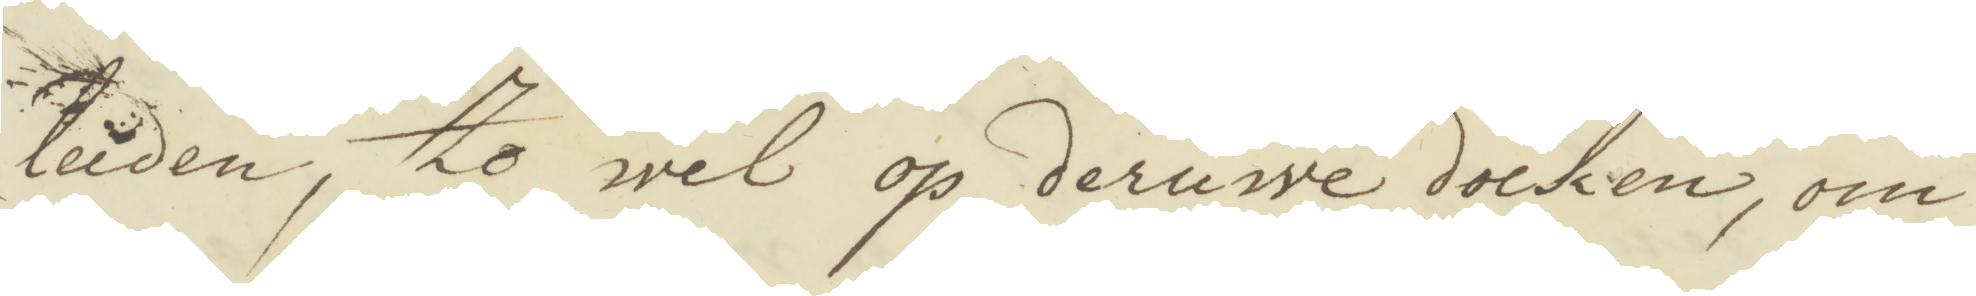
leeden, zo wel op deruwe doeken, om
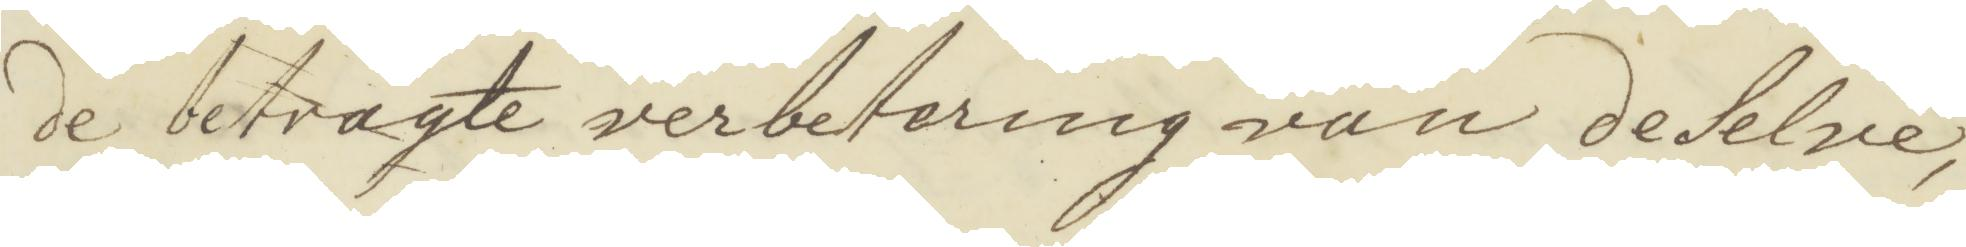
de betragte verbetering van deselve,
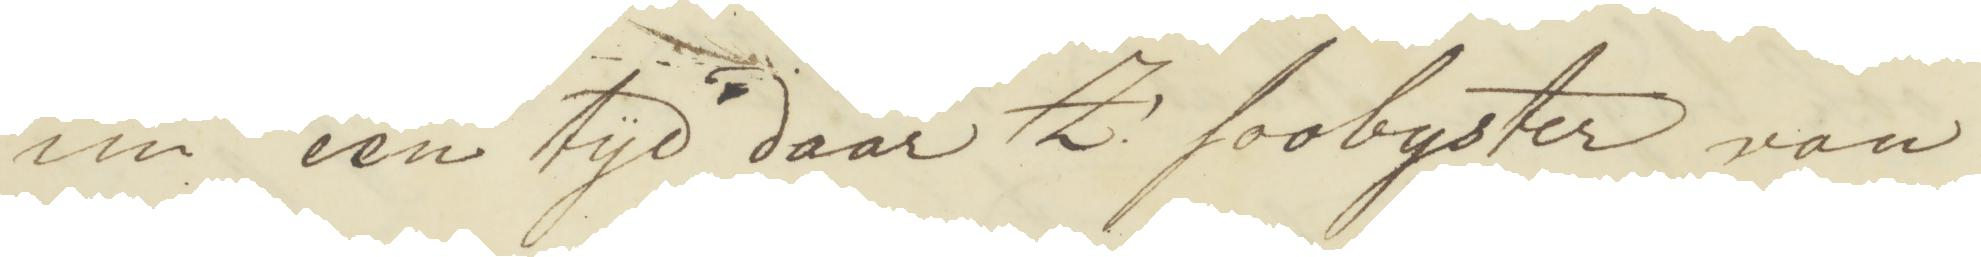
in een tijd daar z' soo byster van
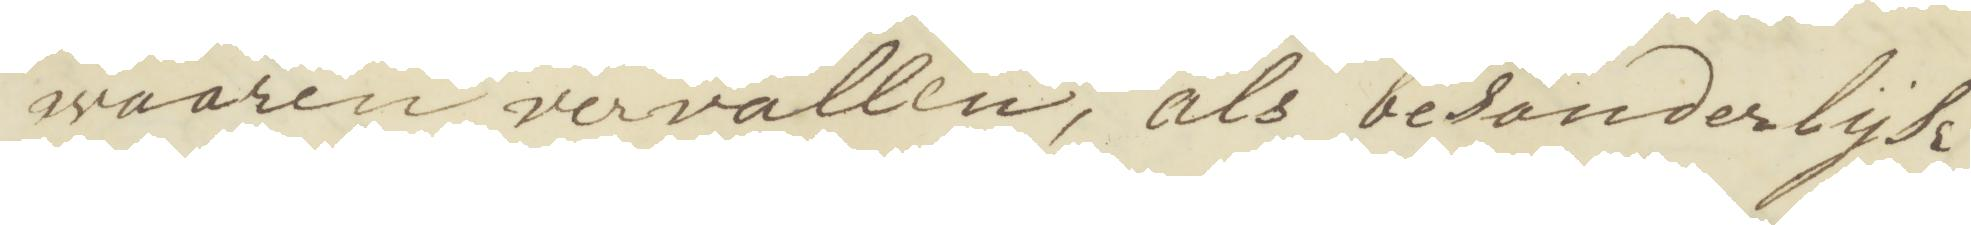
waaren vervallen, als besonderlijk
